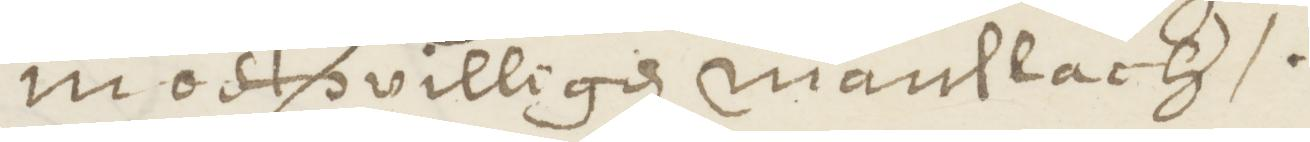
moetvilligen manslach/.
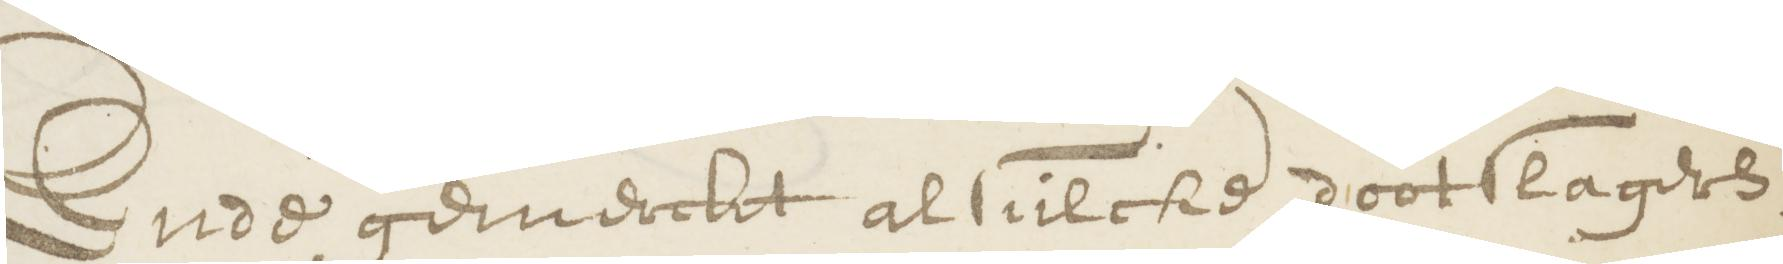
Ende gemerkt alsulcke dootslagers
